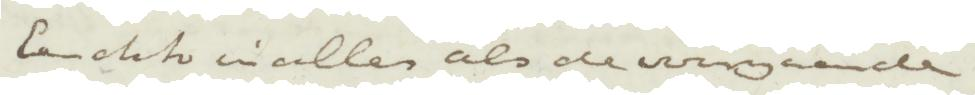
Een dito in alles als de voorgaande
